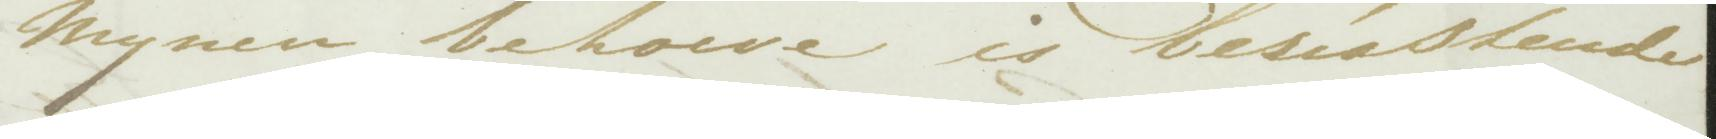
mynen behoeve is berustende
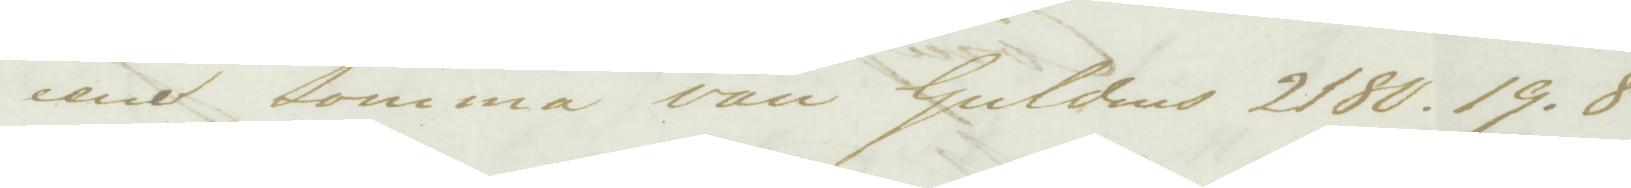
eene somma van Guldens 2180.19. 8
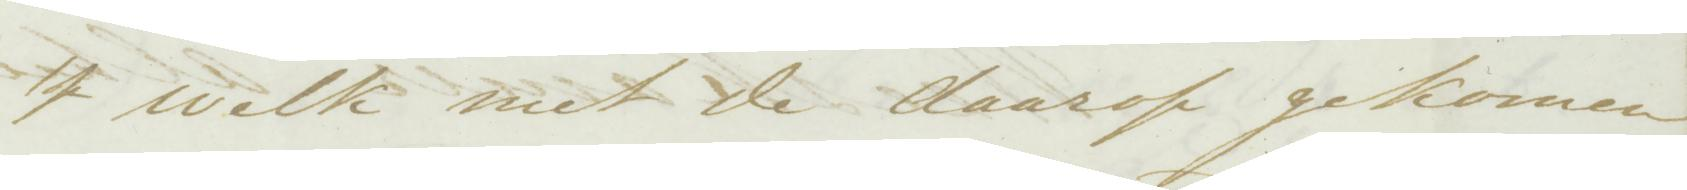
't welk met de daarop gekomen
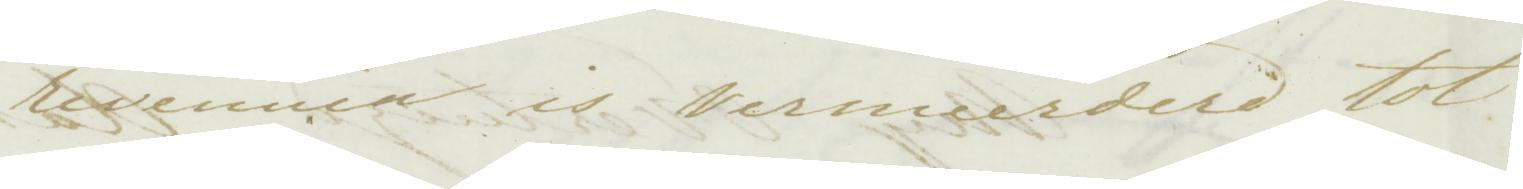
revenuen is vermeerderd tot
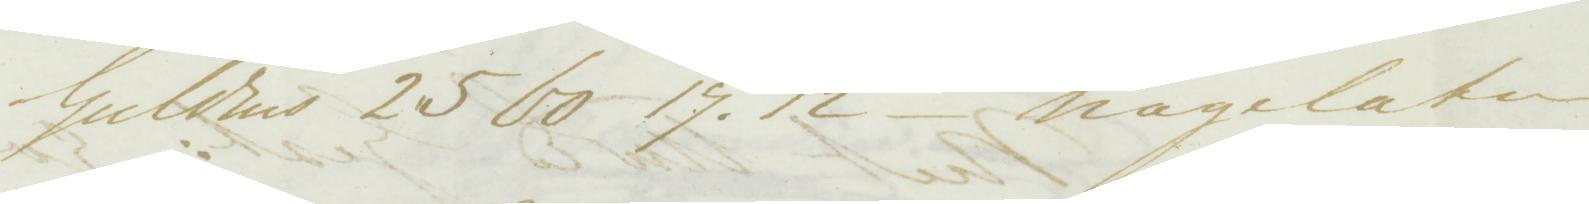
Guldens 25 60 17. 12 — nagelaten
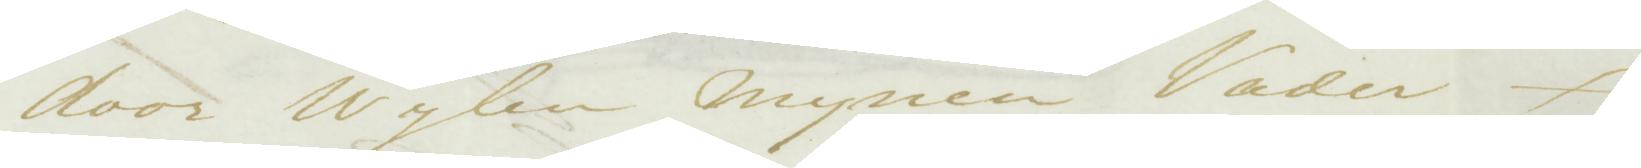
door wylen mynen Vader
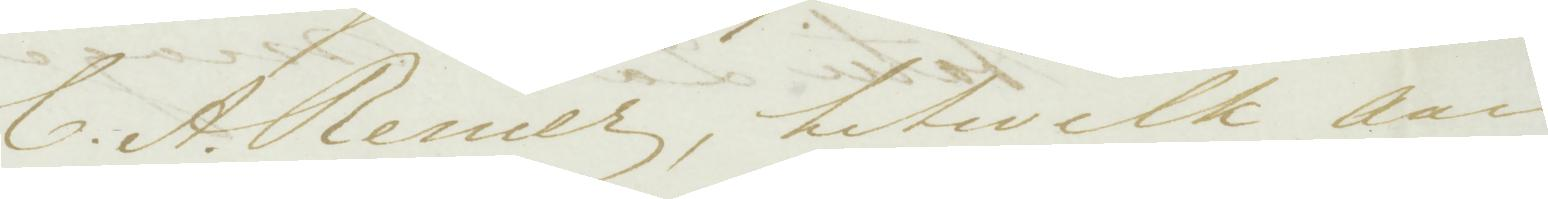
C.A. Remer, hetwelk aan
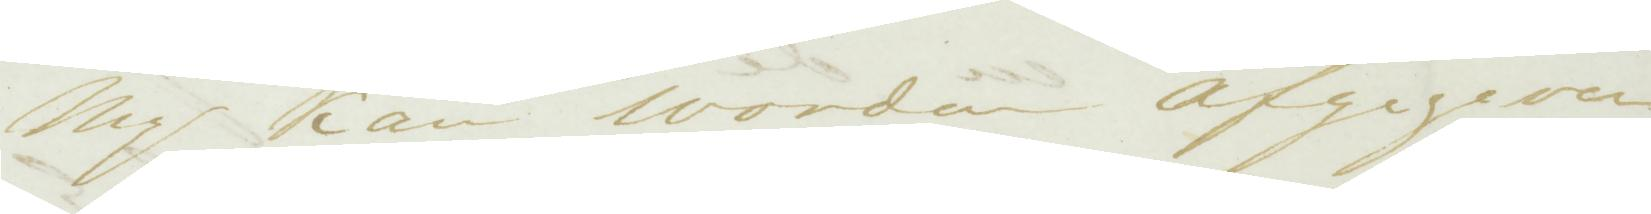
my kan worden afgegeven
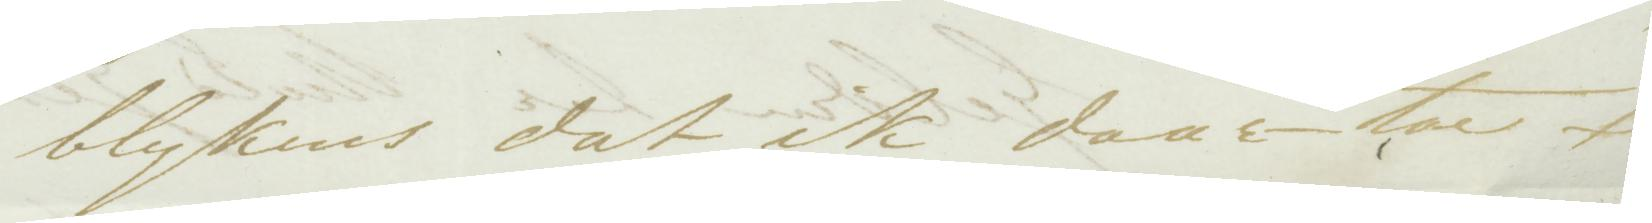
blykens dat ik daar toe
